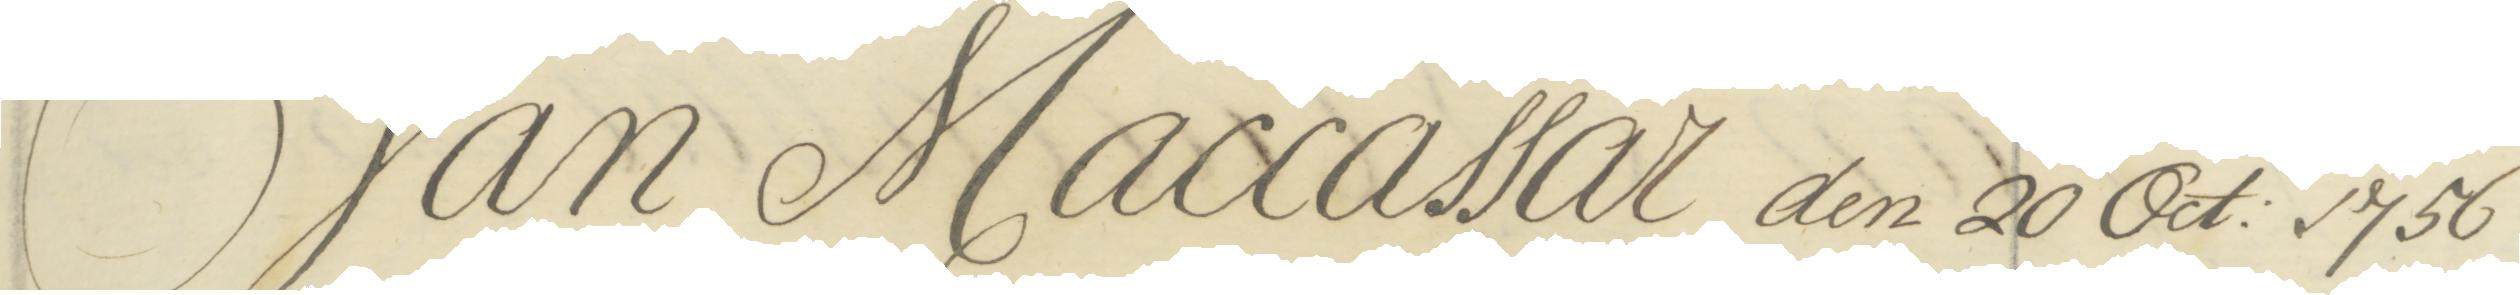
Van Maccassar den 20 Oct: 1756
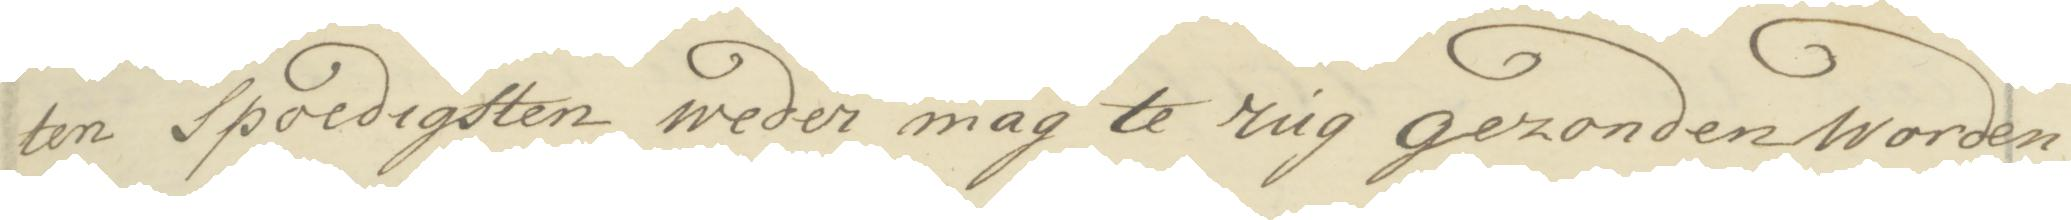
ten spoedigsten weder mag te rug gezonden worden
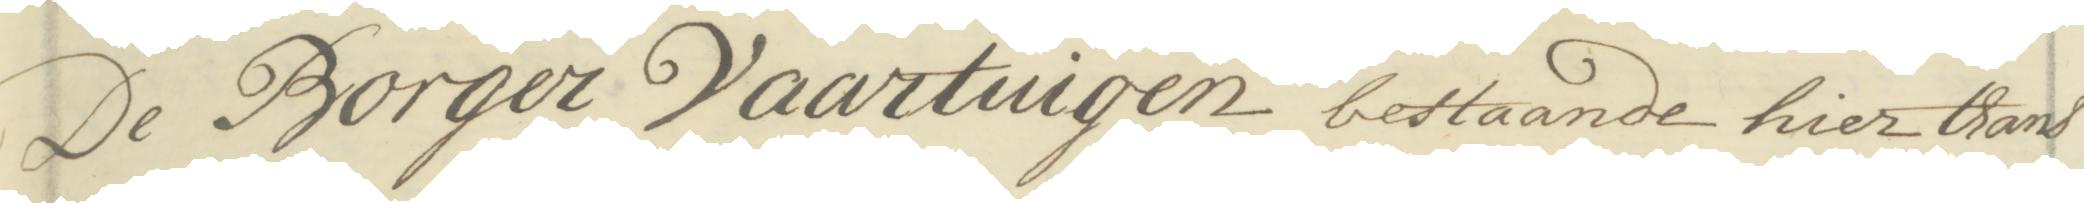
De Borger Vaartuigen bestaande hier thans
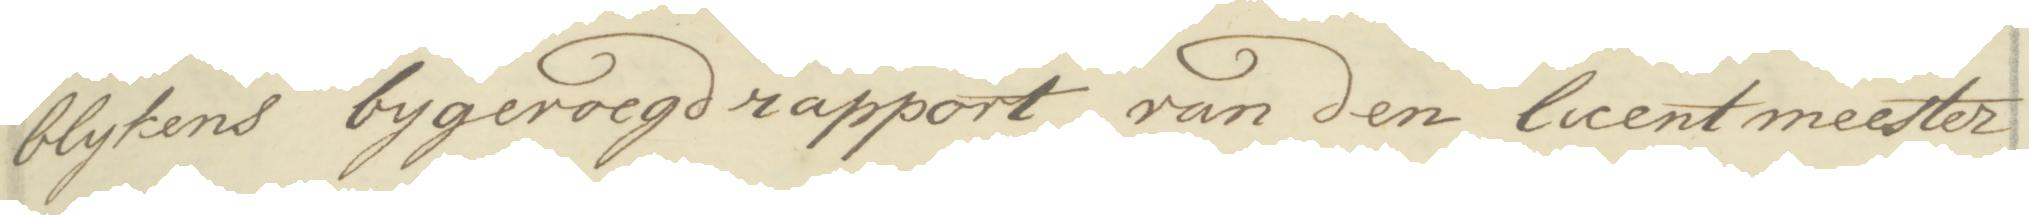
blykens bij gevoegd rapport van den licentmeester
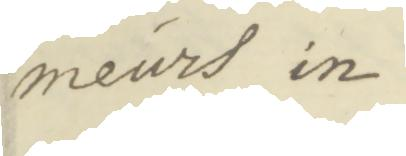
meurs in
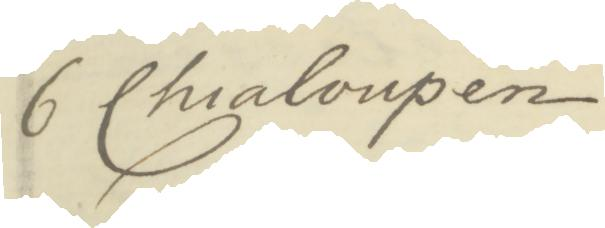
6 Chialoupen
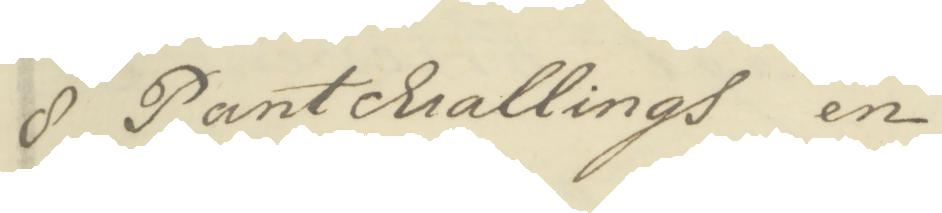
8 Pantchiallings en
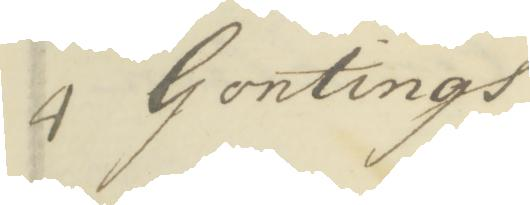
4 Gontings
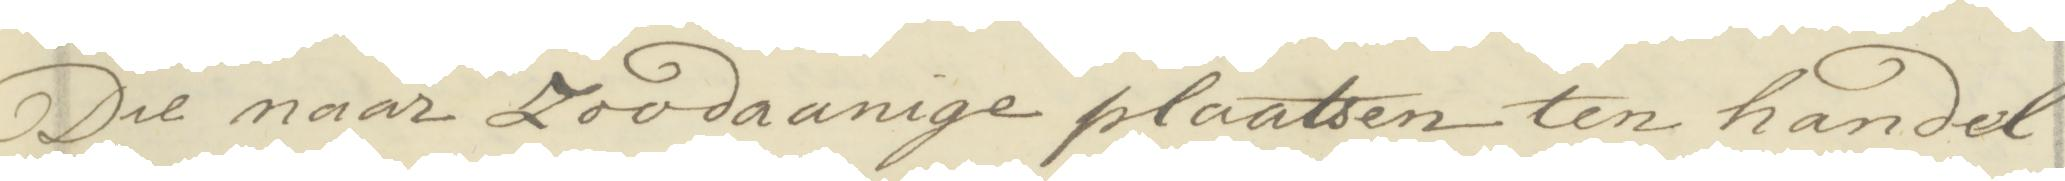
Die naar zoodaanige plaatsen ten handel
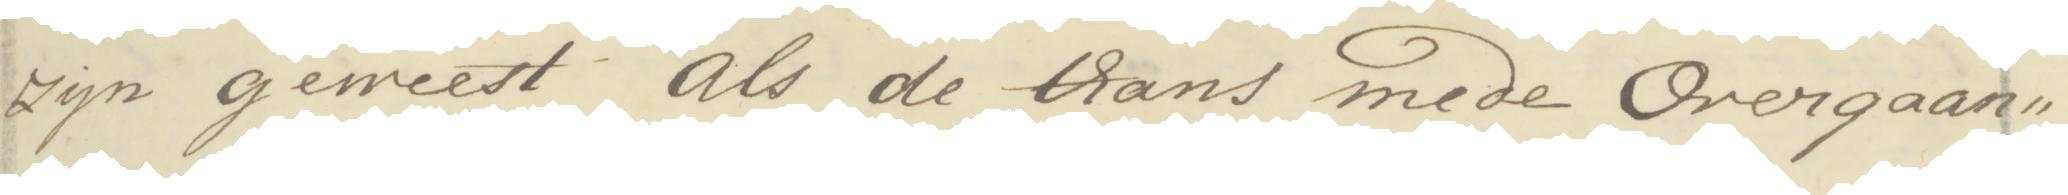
zijn geweest als de thans mede Overgaan„
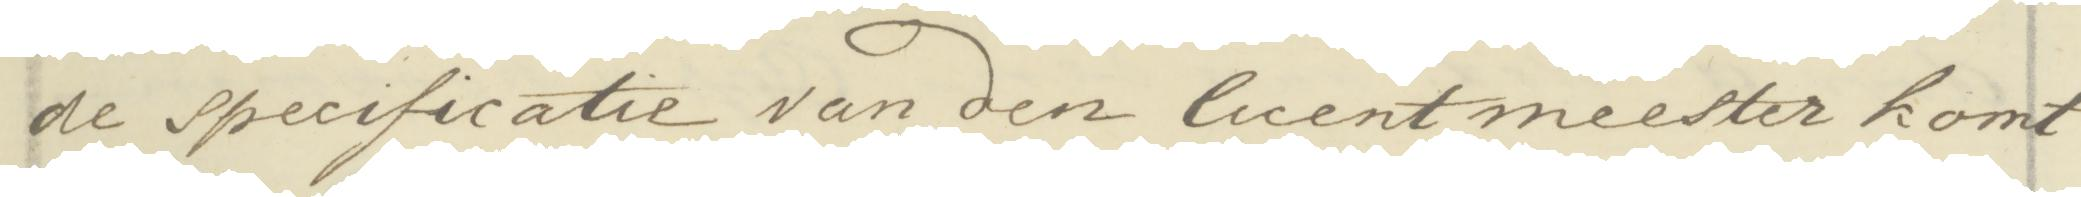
de specificatie van den licentmeester komt
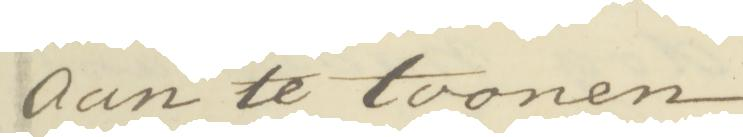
aan te toonen
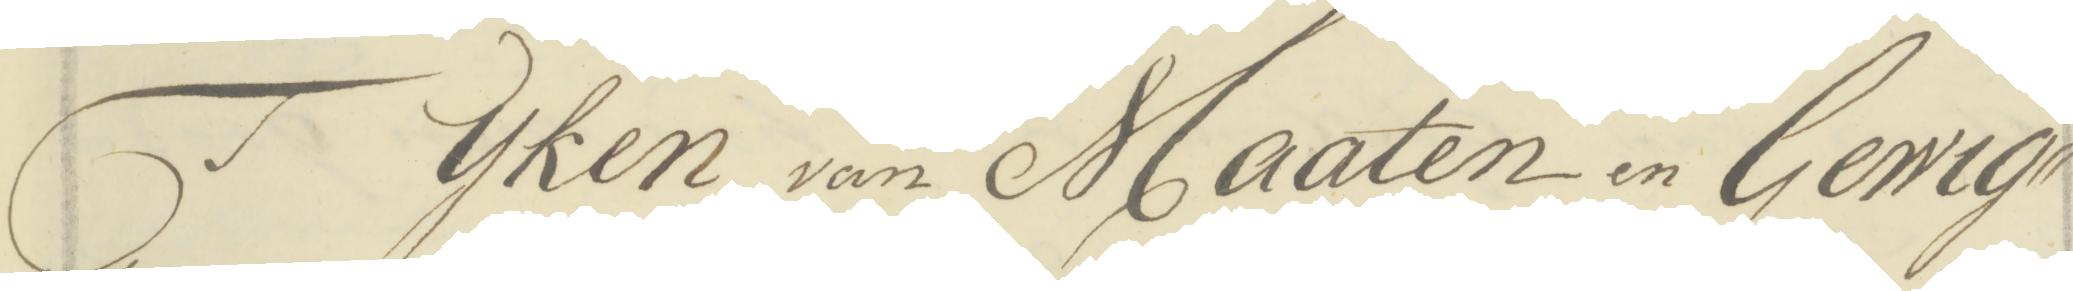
T yken van Maaten en Gewig
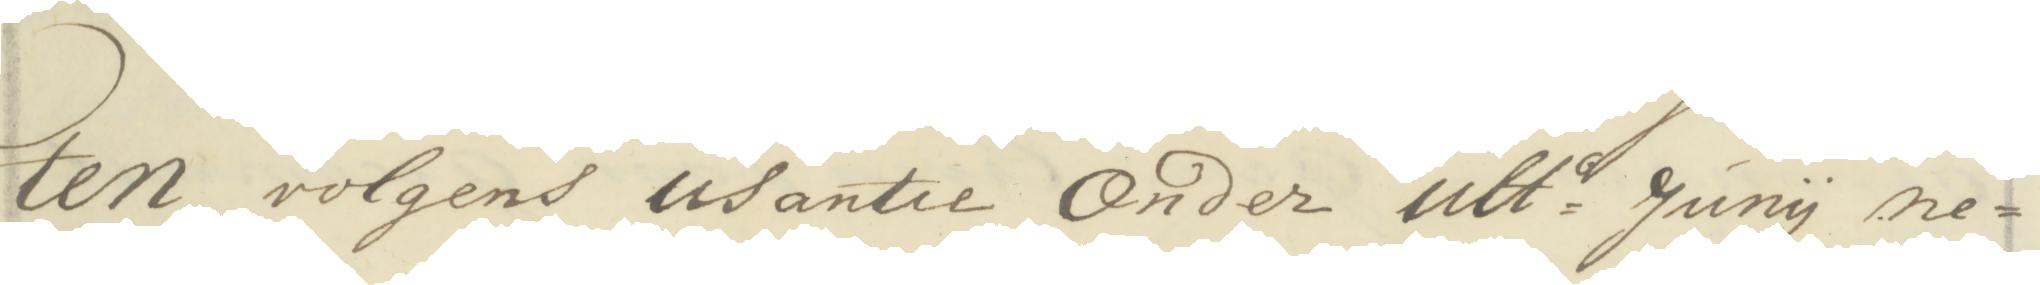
ten volgens usantie Onder ult=o junij ne=
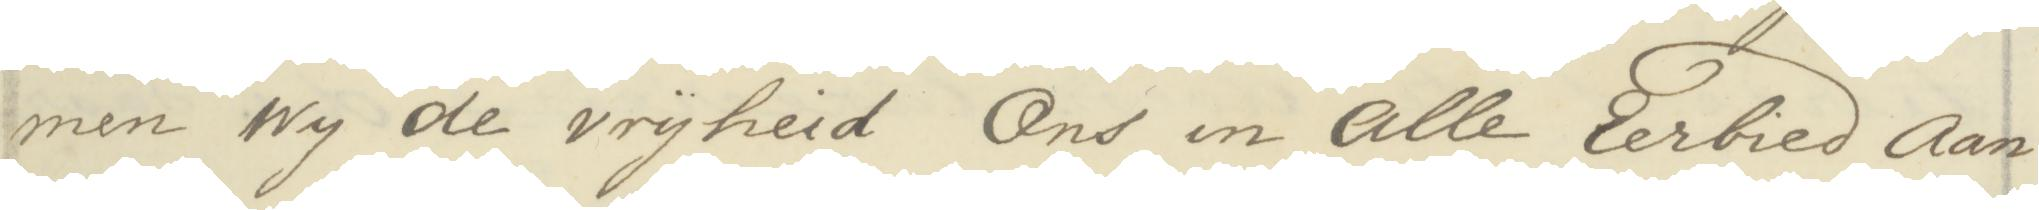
men wy de vrijheid Ons in alle Eerbied aan
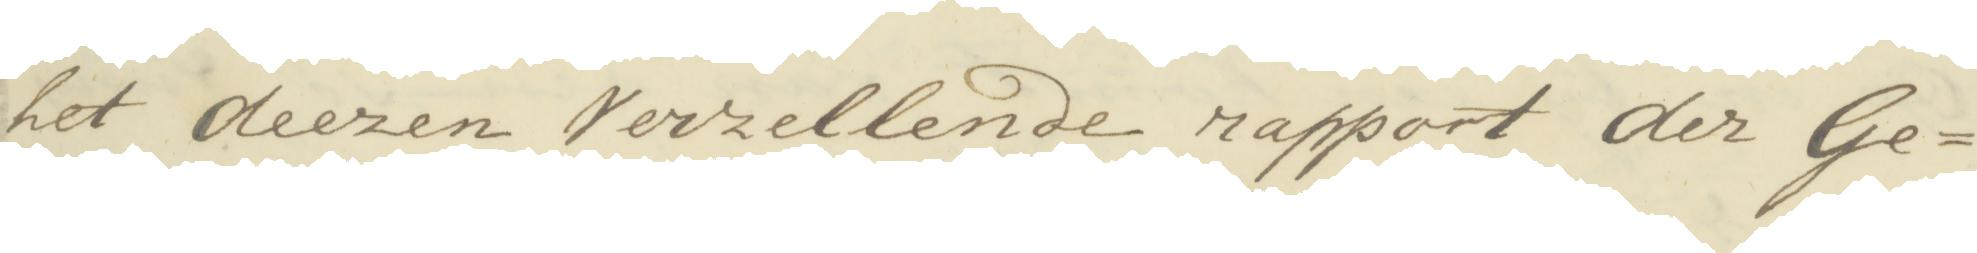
het deezen verzellende rapport der Ge=
